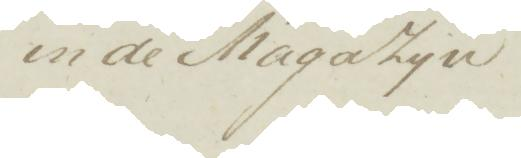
in de Magazijn.
